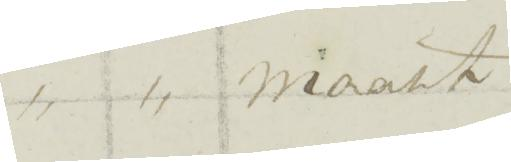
„ „ maart
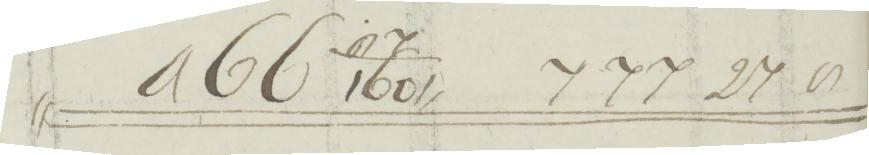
„ 466 87/160„ 777 27 8
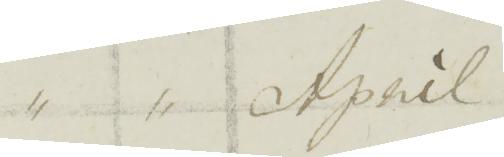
„ „ April
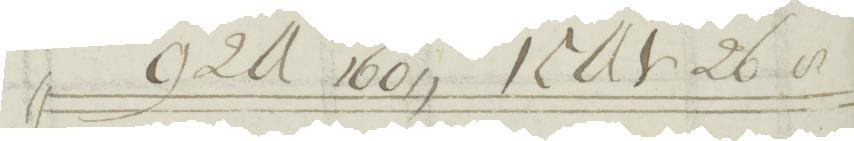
„ 924 149/160„ 1541 26 8
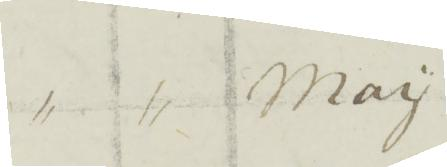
„ „ maij
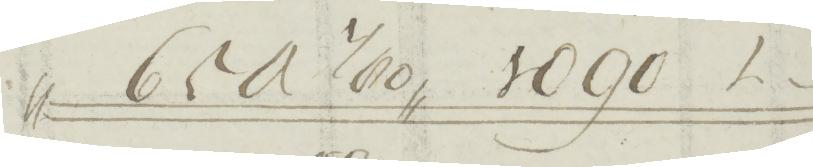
„ 654 7/80„ 1090 1 —
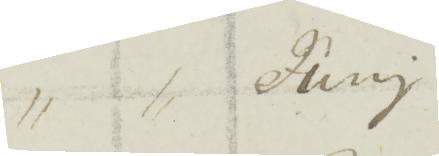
„ „ Iunij
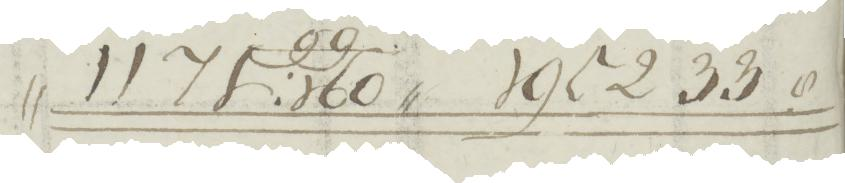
„ 1171:99/160 „ 1952 33 8
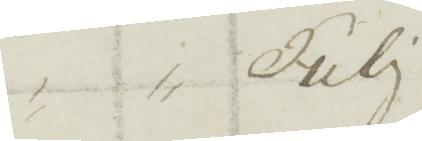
„ „ Iulij
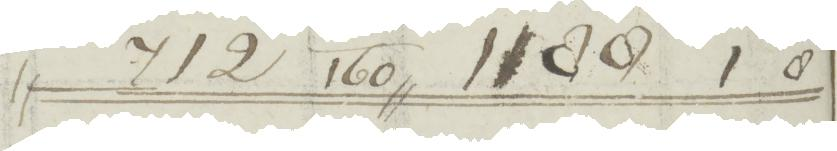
„ 712 131/160„ 1188 1 8
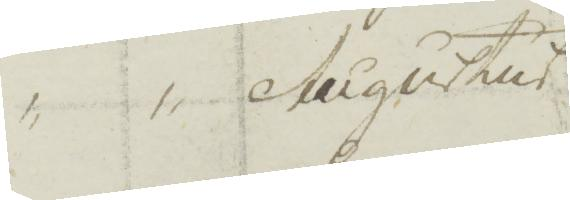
„ „ Augustus
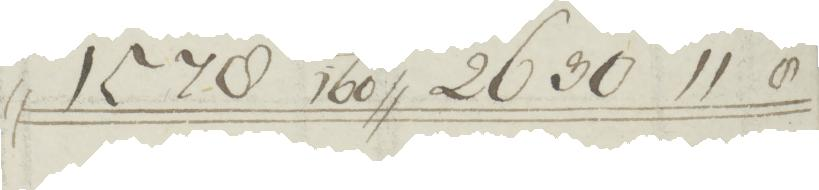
„ 1578 23/160 „ 2630 11 8
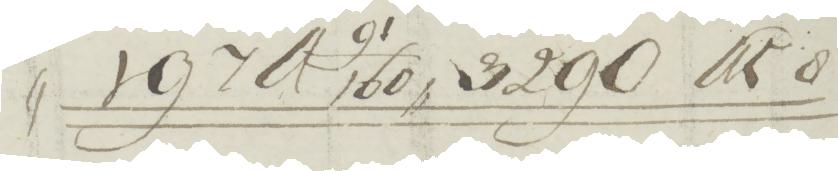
„ 1974 91/160 „ 3290 45 8
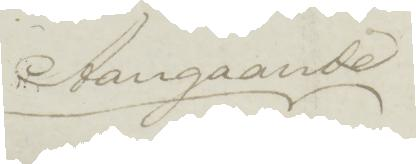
Aangaande
